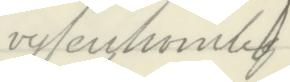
vyf entwintig
